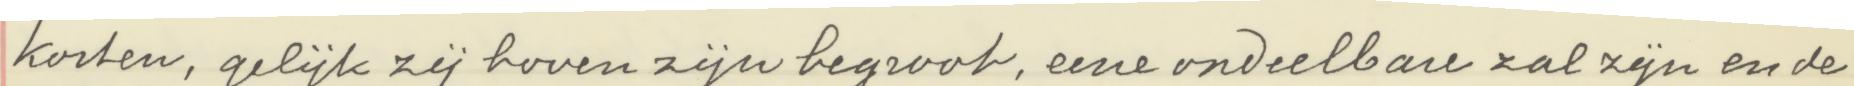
kosten, gelijk zij boven zijn begroot, eene ondeelbare zal zijn en de
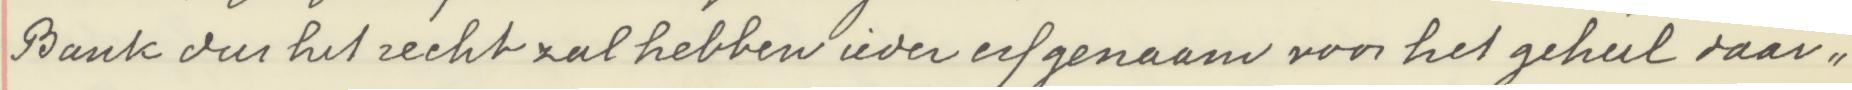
Bank dus het recht zal hebben ieder erfgenaam voor het geheel daar„
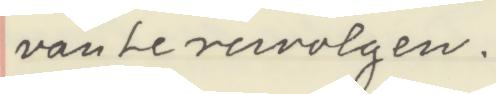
van te vervolgen.
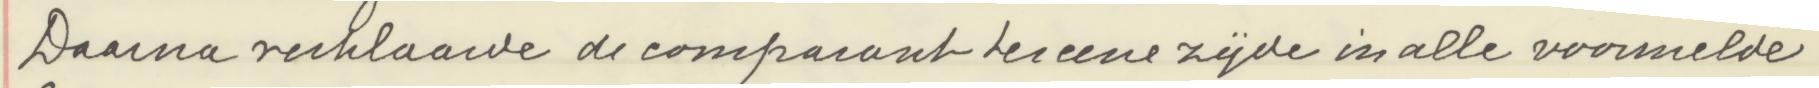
Daarna verklaarde de comparant ter eene zijde in alle voormelde
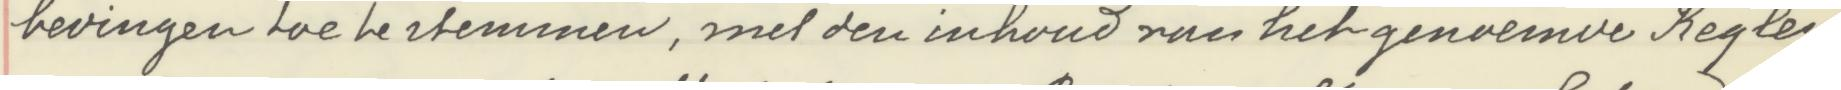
bedingen toe te stemmen, met den inhoud van het genoemde Regle
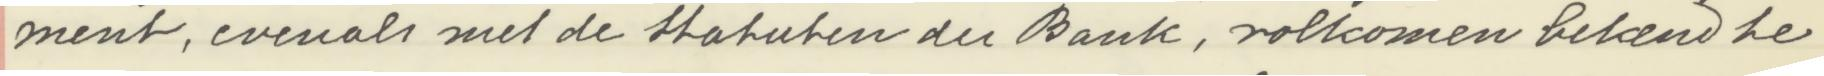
ment, evenals met de statuten der Bank, volkomen bekend te
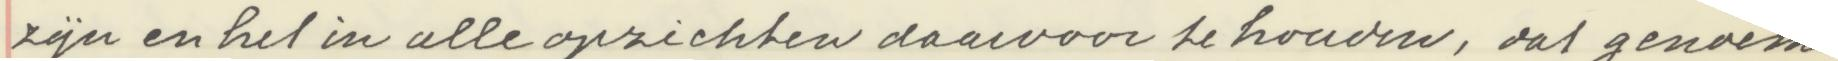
zijn en het in alle opzichten daarvoor te houden, dat genoemd
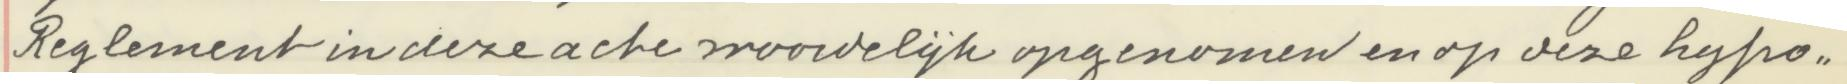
Reglement in deze acte woordelijk opgenomen en op deze hypo„
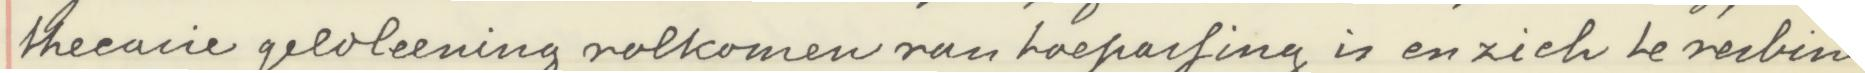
thecaire geldleening volkomen van toepassing is en zich te verbin
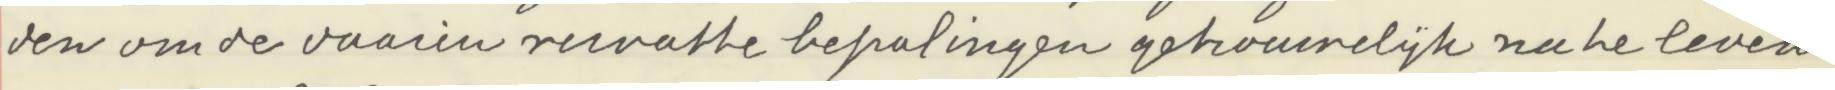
den om de daarin vervatte bepalingen getrouwelijk na te leven
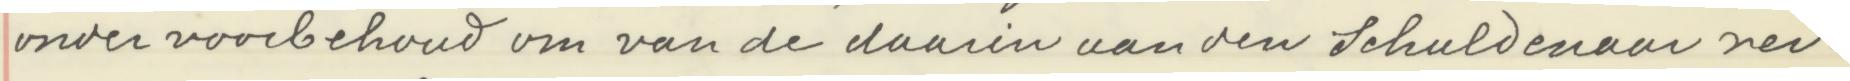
onder voorbehoud om van de daarin aan den schuldenaar ver-
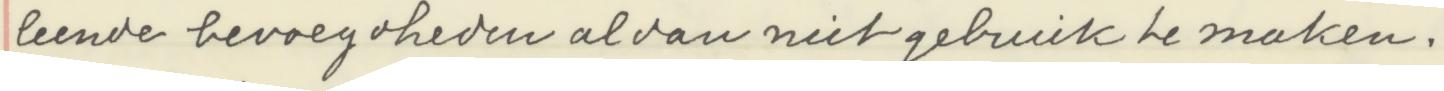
leende bevoegdheden aldan niet gebruik te maken.
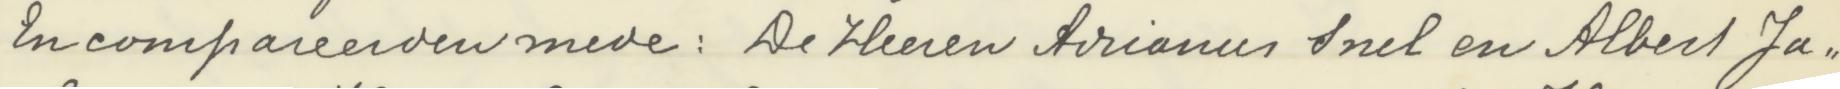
En compareerden mede: De Heeren Adrianus Snel en Albert Ja„
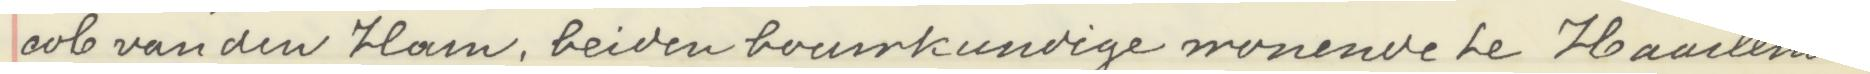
cob van den Ham, beiden bouwkundige wonende te Haarlem,
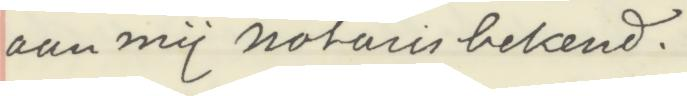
aan mij notaris bekend.
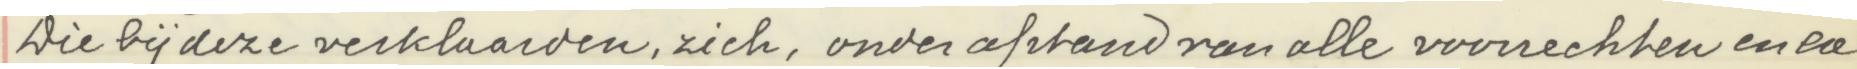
Die bij deze verklaarden, zich, onder afstand van alle voorrechten en re
